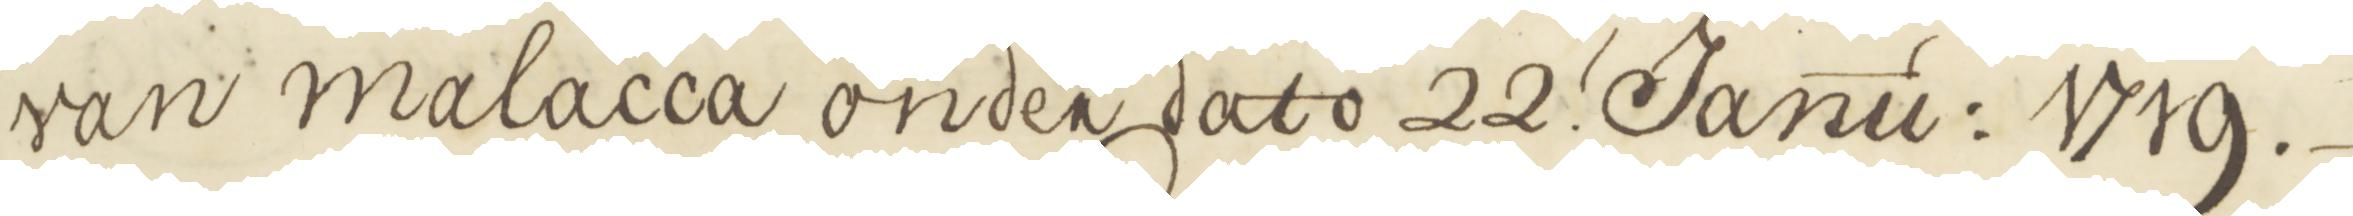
van malacca onder dato 22.' Janu: 1719.
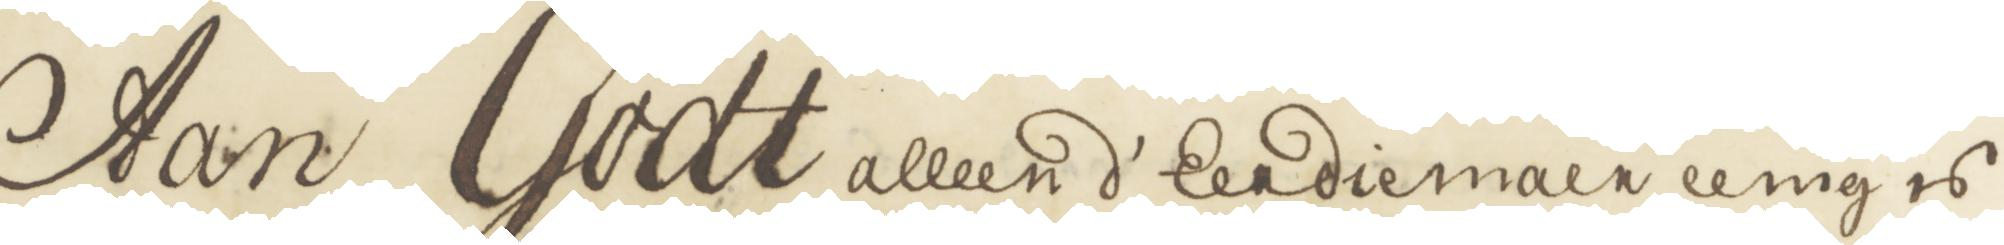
Aan Godt alleen d’Eer die maer eenig is
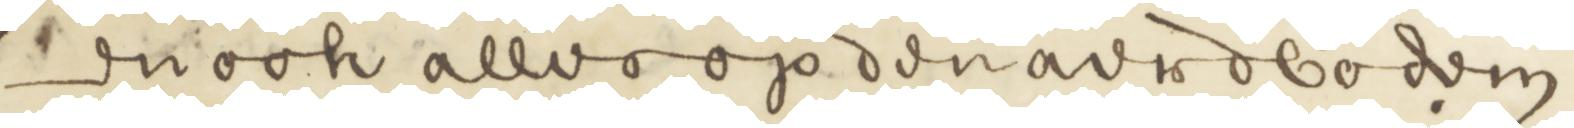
een ook alles op den aerdbodem
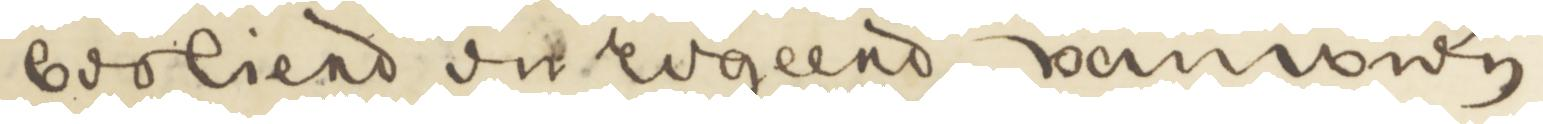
bestierd en regeerd van wien
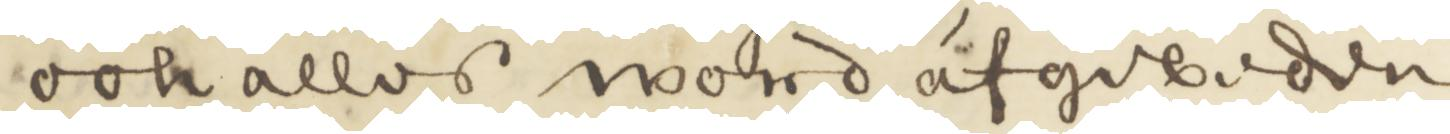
ook alles word afgebeden
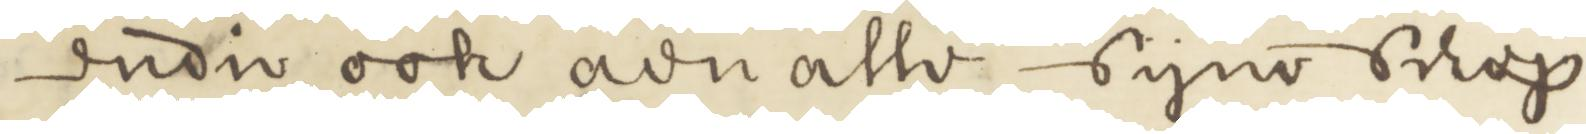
en die ook aen alle sijne schep
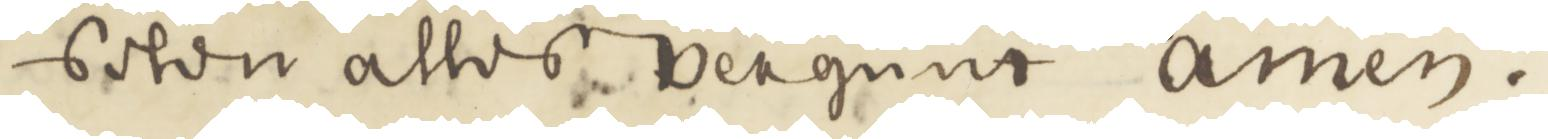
selen alles vergunt amen.
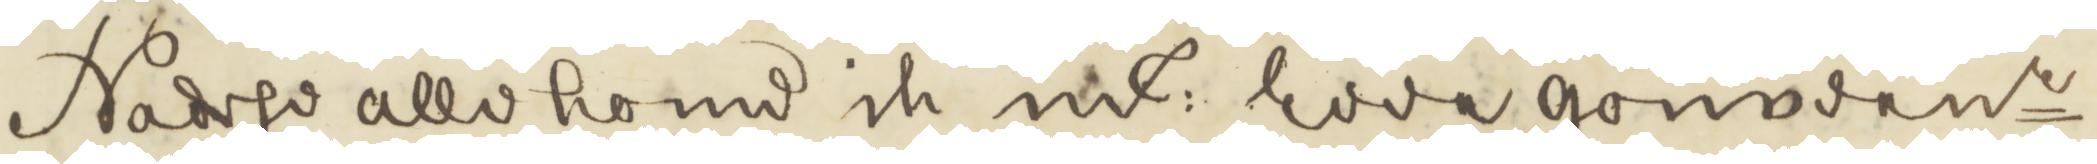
Nadese alle kome ik uE: heer gouvern=r
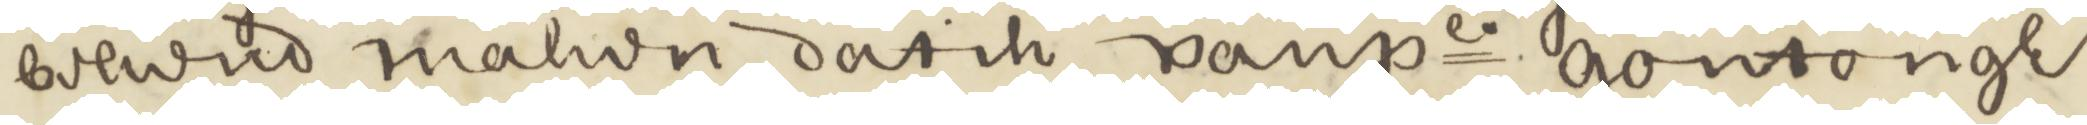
bekend maken dat ik van p=lo gontongh
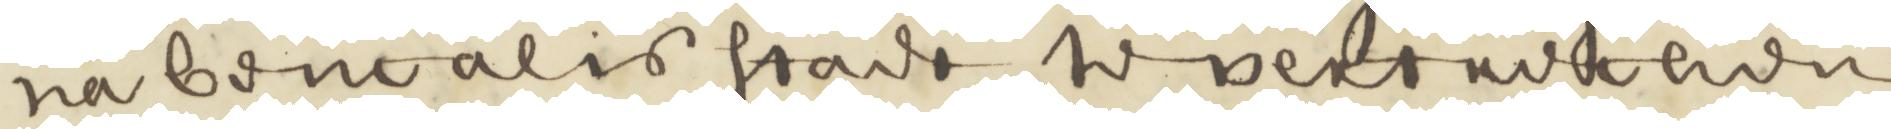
na bencalis staet te vertrekken
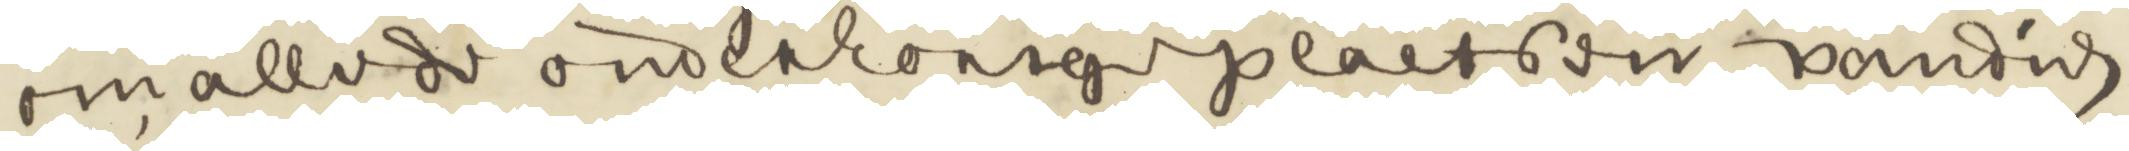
om alle de onderhorige plaetsen vandien
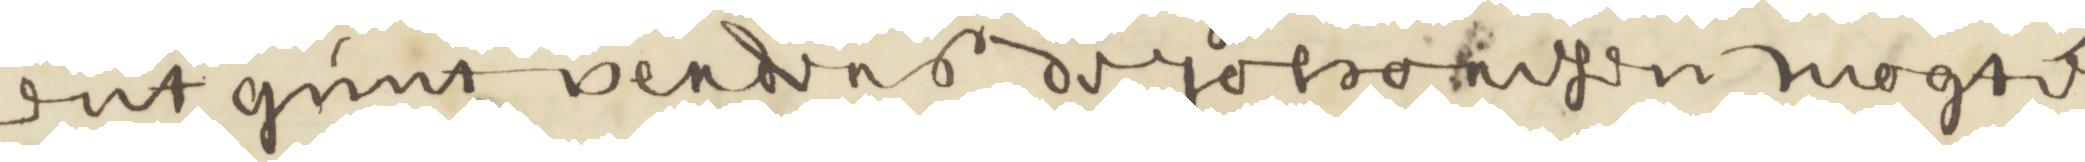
en't gunt verders de johooresen mogte
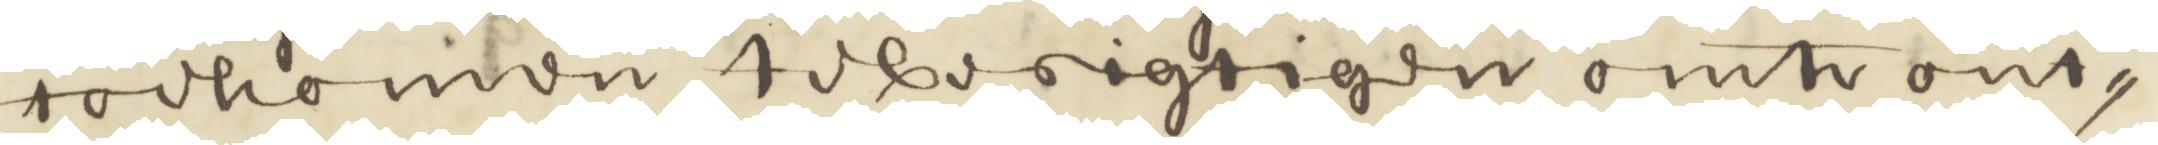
toekomen te besigtigen omte ont„
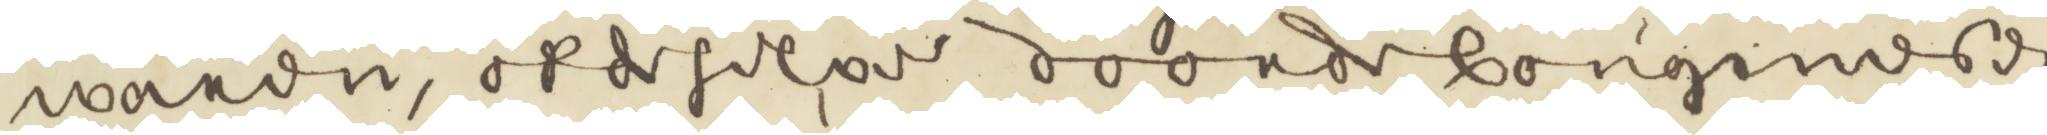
waren, of deselve door de bouginesen
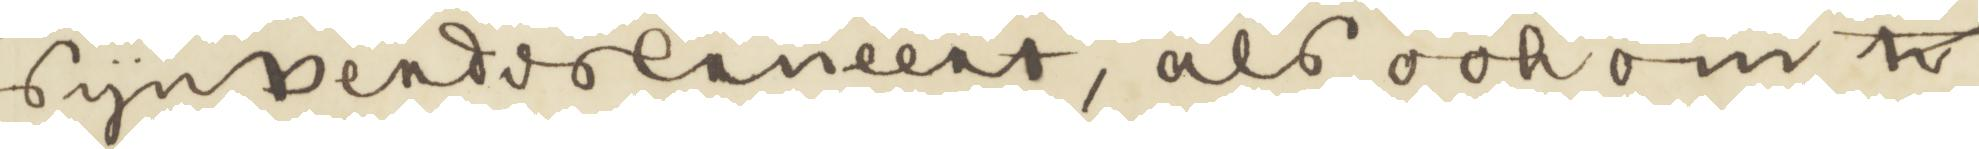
sijn verdestrueert, als ook om te
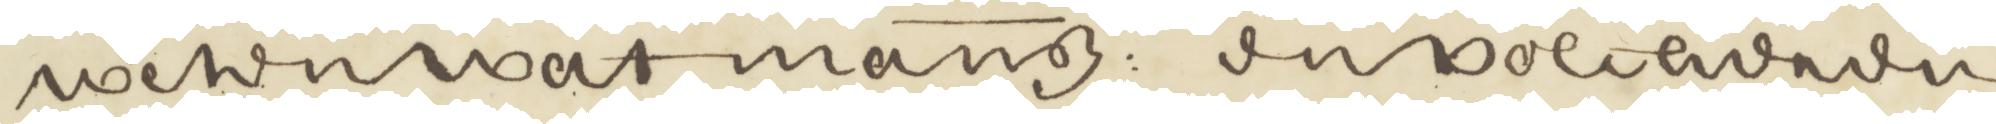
weten wat mansz: en volckeren
